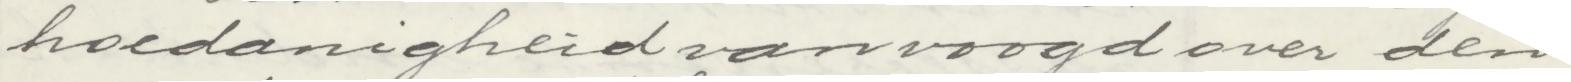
hoedanigheid van voogd over den
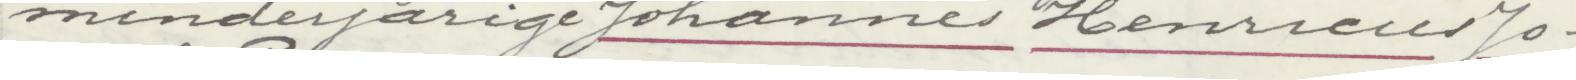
minderjarige Johannes Henricus Jo
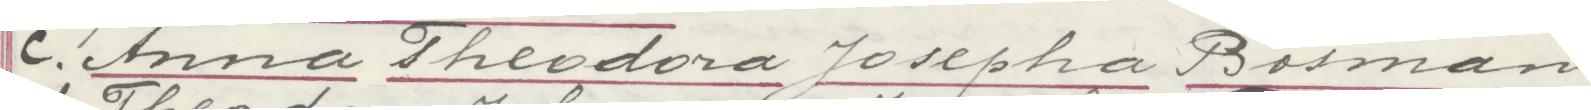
c. Anna Theodora Josepha Bosman
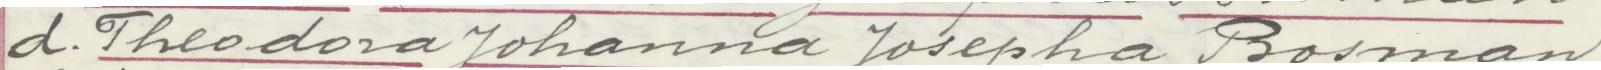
d. Theodora Johanna Josepha Bosman
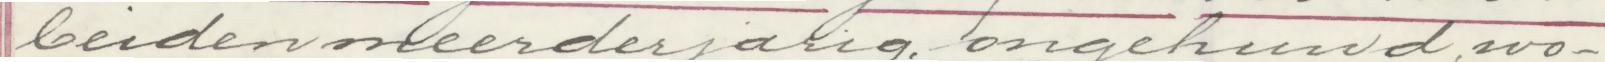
beiden meerderjarig, ongehuwd, wo-
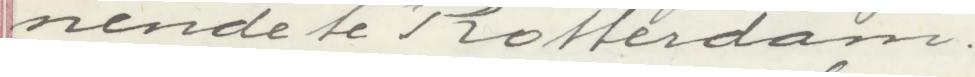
nende te Rotterdam
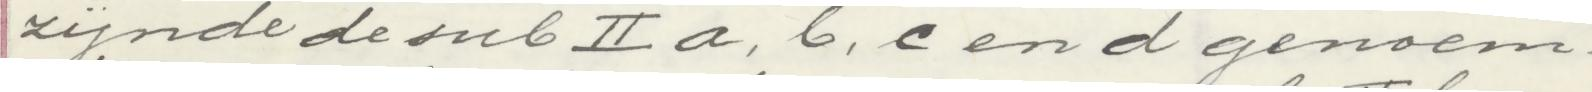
zijnde de sub II a, b, c en d genoem
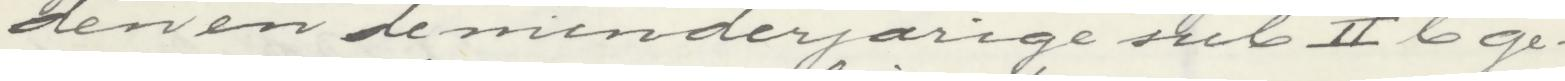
den en de minderjarige sub II b ge
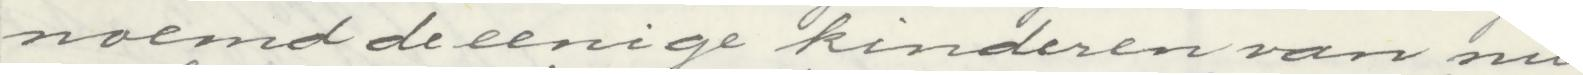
noemd de eenige kinderen van nu
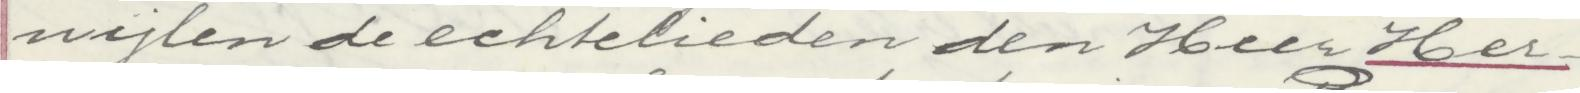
wijlen de echtelieden den Heer Her-
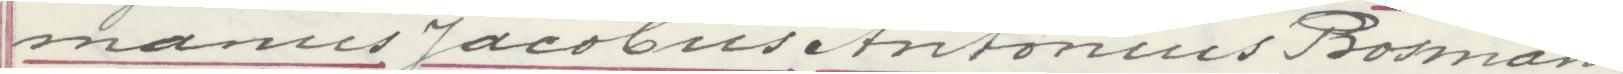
manus Jacobus Antonius Bosman
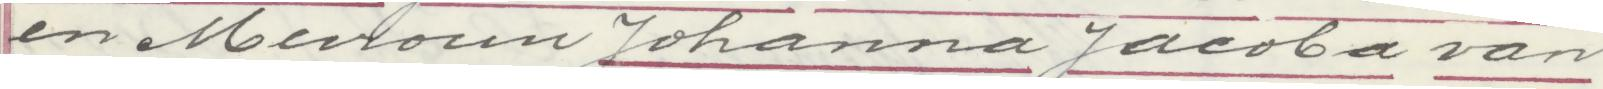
en Mevrouw Johanna Jacoba van
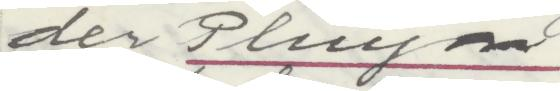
der Pluym
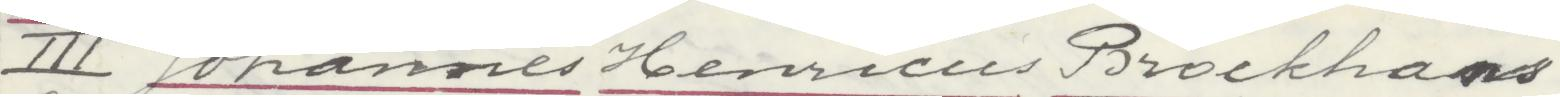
III Johannes Henricus Broekhans
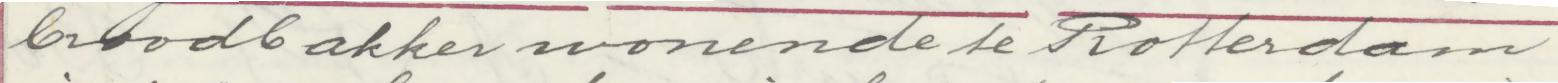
broodbakker wonende te Rotterdam
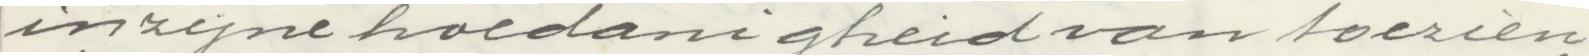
in zijne hoedanigheid van toezien
